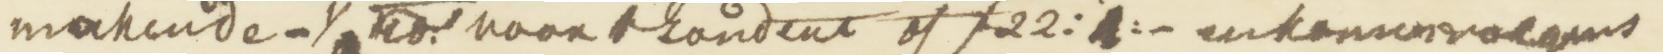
makende — 1/4 rd:s voor 1 hondert of ƒ 22: 4: — en konnen volgens
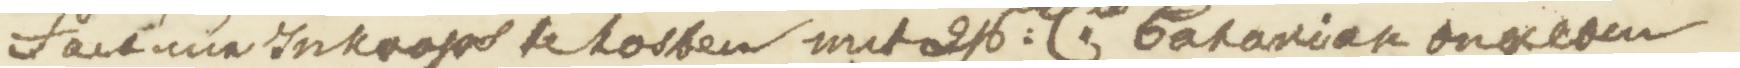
factuur Inkoops te kosten met 2 p:r C„to bataviase ongelden
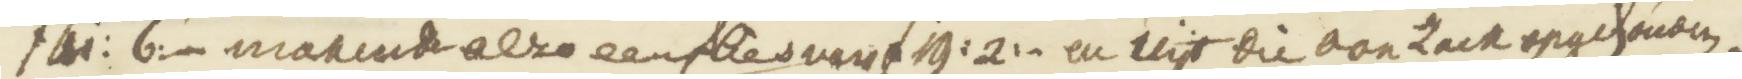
ƒ 41: 6: — makende alzo een verlies van ƒ 19: 2: — en uijt die oor zack opgehouden
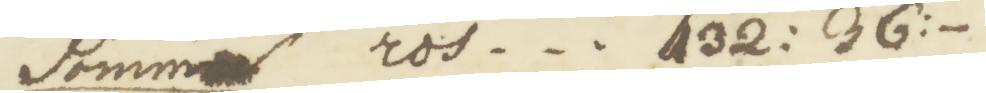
Somme rds . . . 432: 36: —
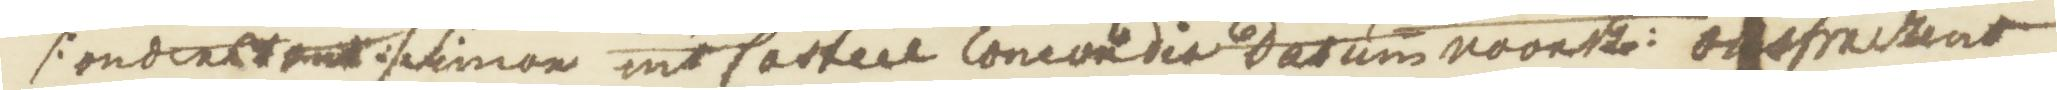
/:onderstont:/ Timor in’t Casteel concordia datum voorsz: onsprezent
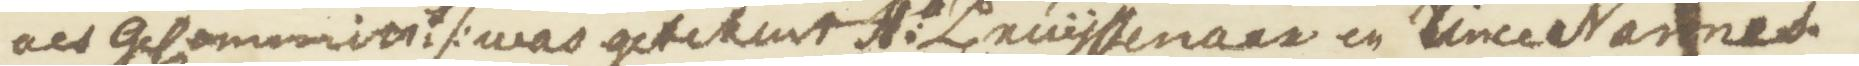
als gecommitt:t /:was getekent H:o Pruijssenaar en Rince Nannes.
